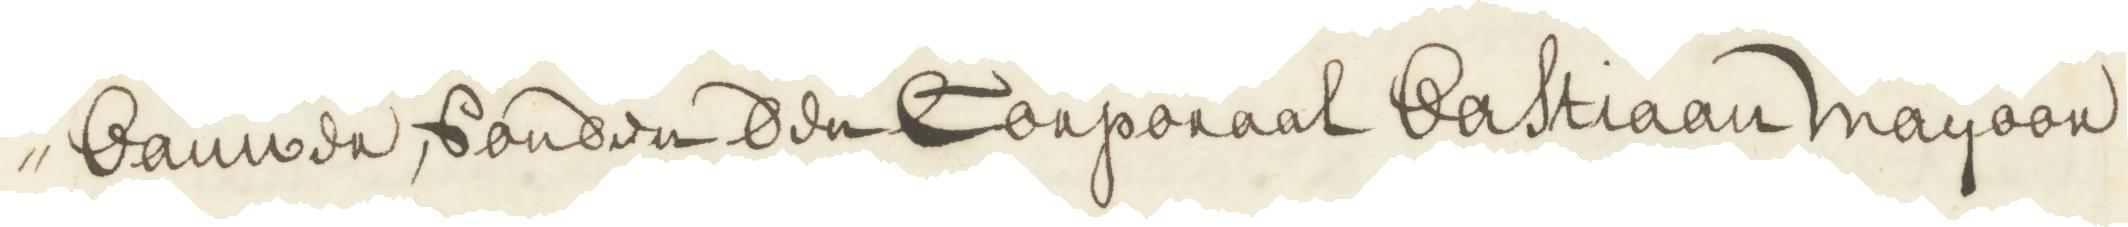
„bauwer, sonden den Corporaal bastiaan maijoor
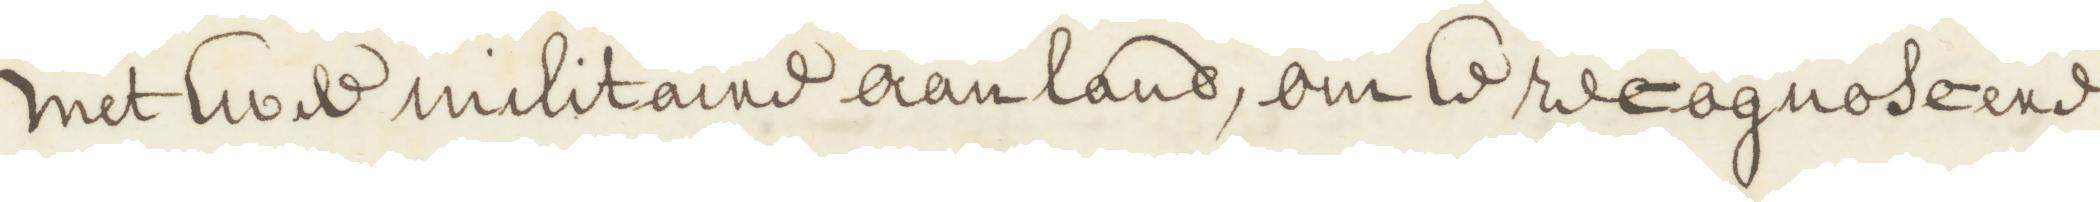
met twee militaire aan land, om te recognoscere
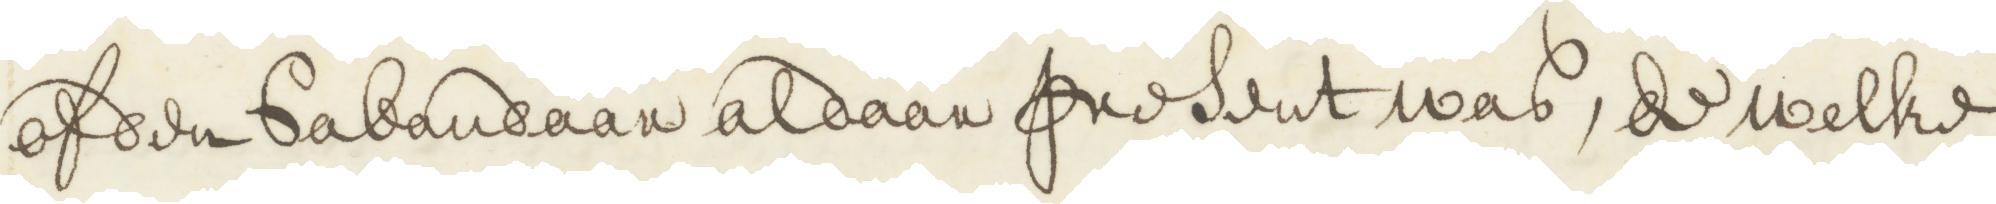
of den Sabandaar aldaar present was, de welke
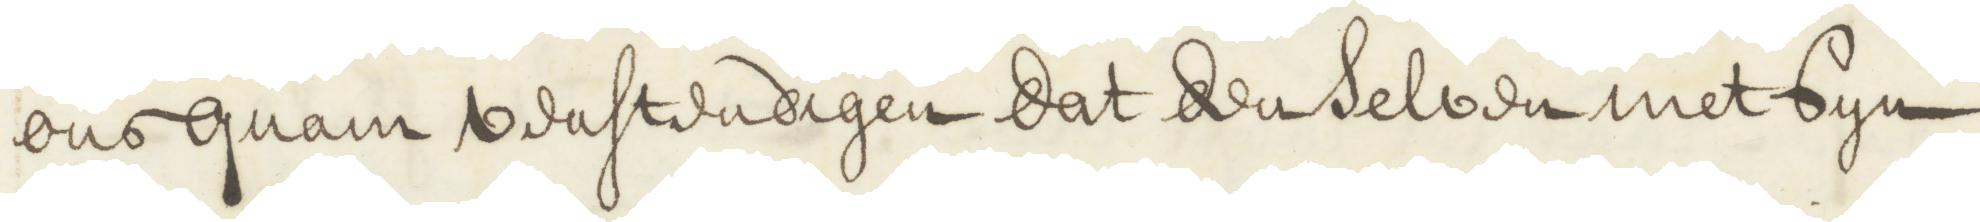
ons quam verstendigen dat denselven met syn
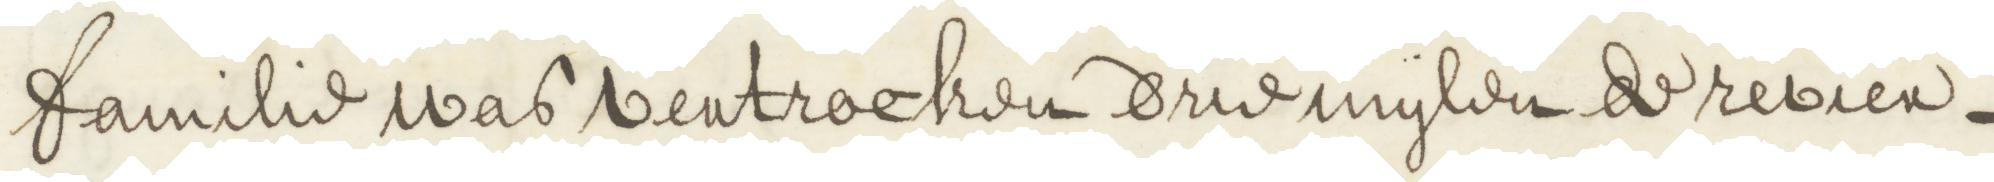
familie was vertrocken drie mijlen de revier_
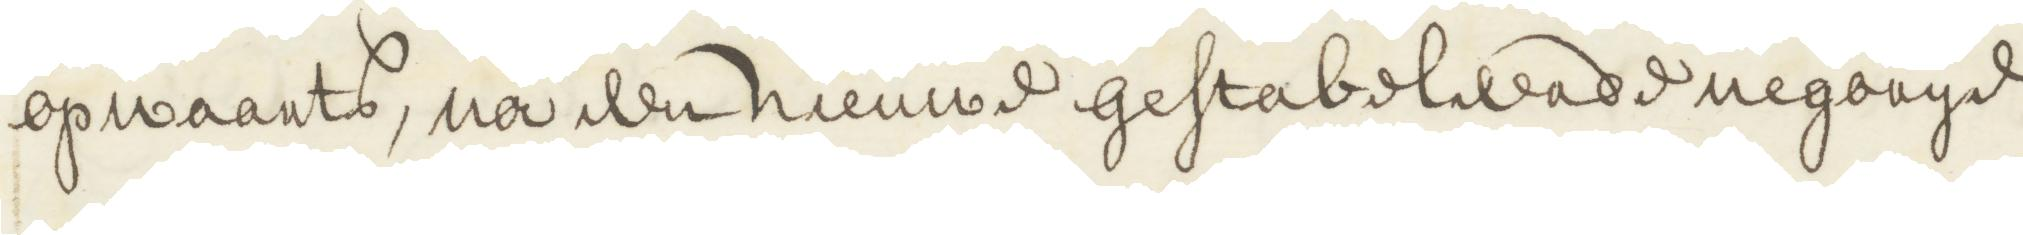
opwaarts, na een nieuwe gestabeleerde negorije
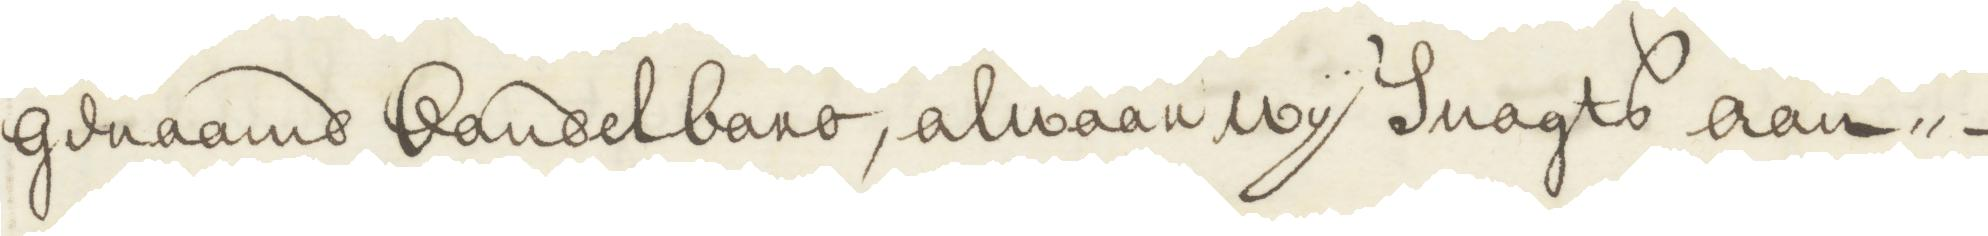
genaamd Bandelbaro, alwaar wij 'snagts aan„_
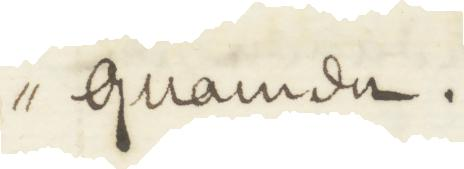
„ quamen.
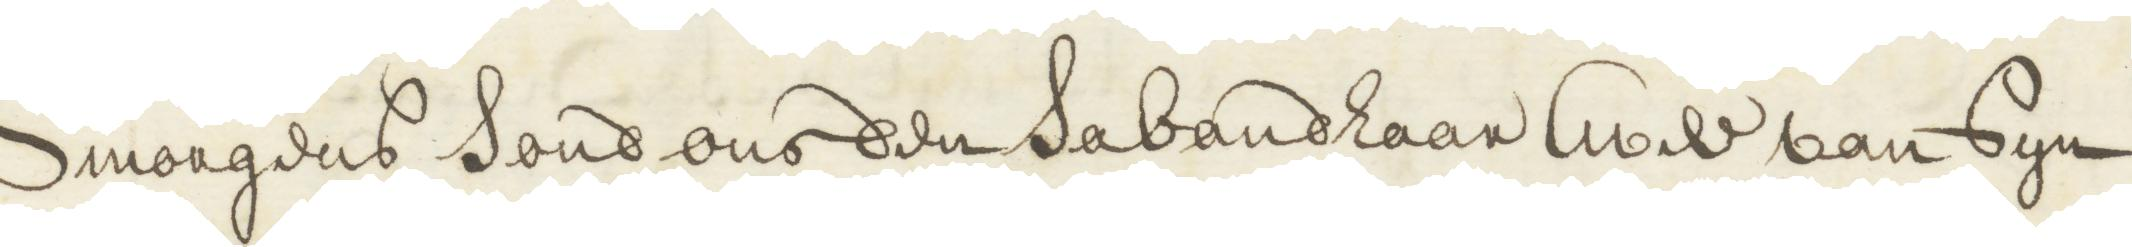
'Smorgens sond ons den sabandhaar twee van syn
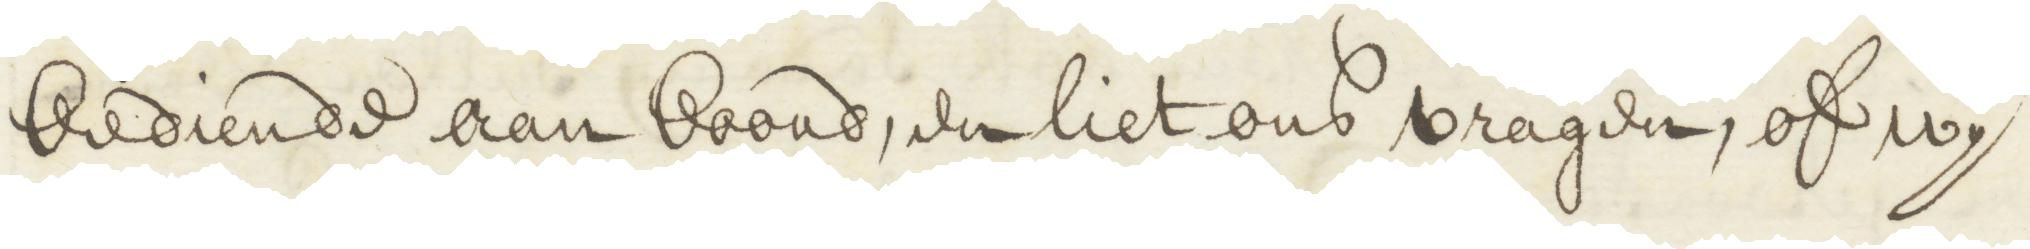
bediende aan boord, en liet ons vragen, of wij
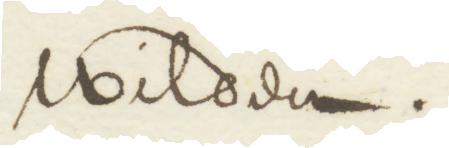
wilden.
